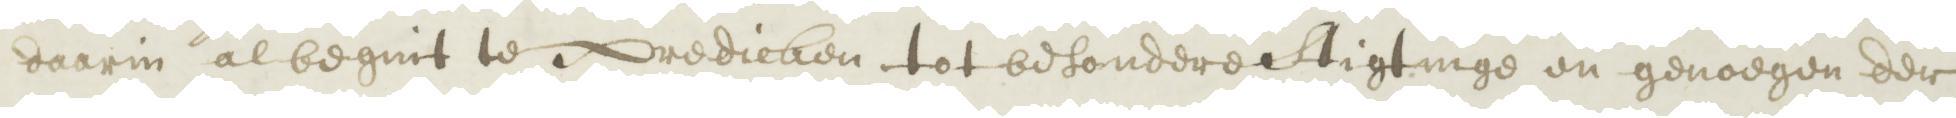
daarin al begint te predieken tot besondere stigtinge, en genoegen der
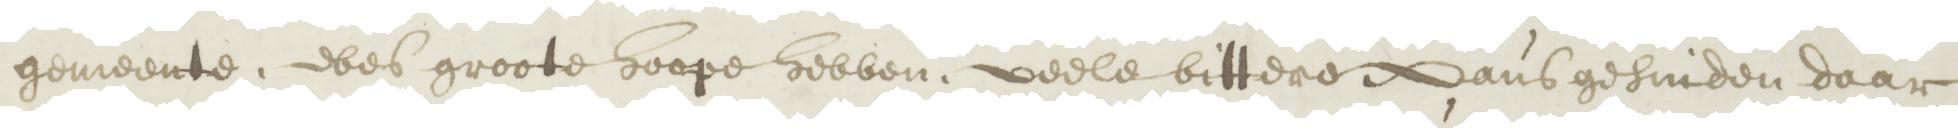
gemeente, wes groote hoope hebben, veele bittere paus gesinden daar
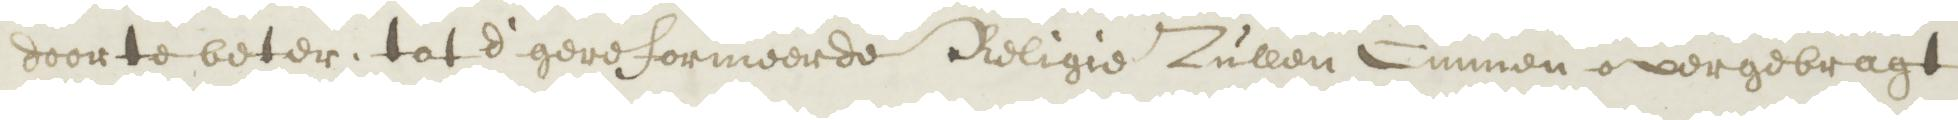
door te beter, tot d’ gereformeerde Religie zullen cunnen overgebragt
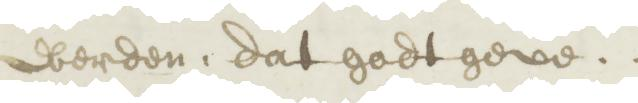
werden, dat godt geve.
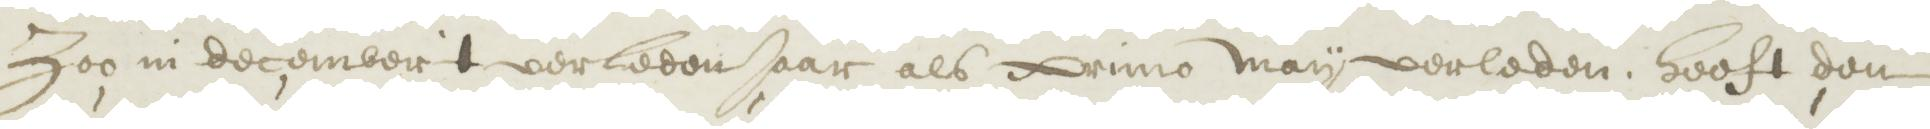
Zoo in december ’t verleden Jaar als primo maij verleden, heeft den
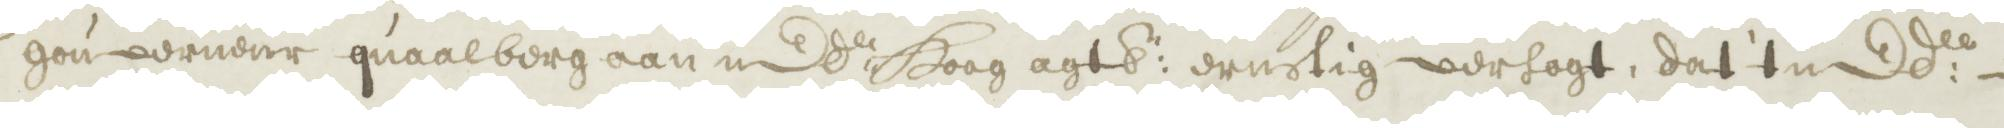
gouverneur quaalberg aan u Ed„le Hoog agtb:' ernstig versogt, dat ’t u Ed:le —
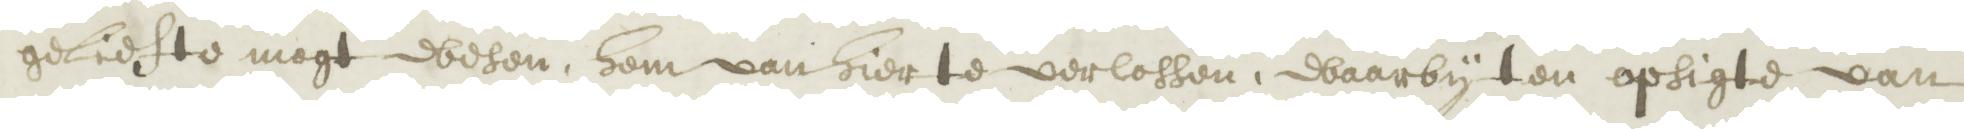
geliefte mogt wesen, hem van hier te verlossen, waarbij ten opsigte van
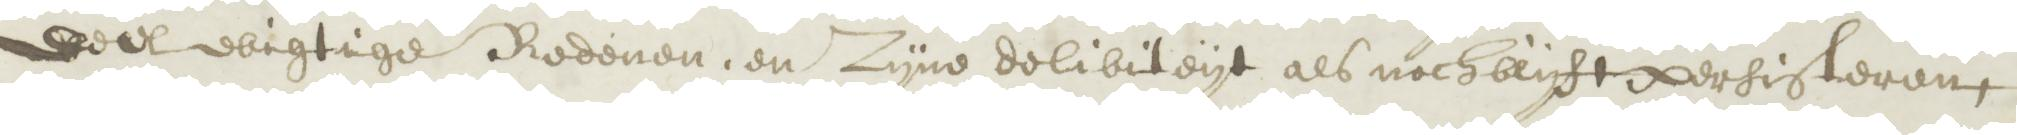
veel wigtige Redenen, en zijne delibiteijt als noch blijft persisteren,
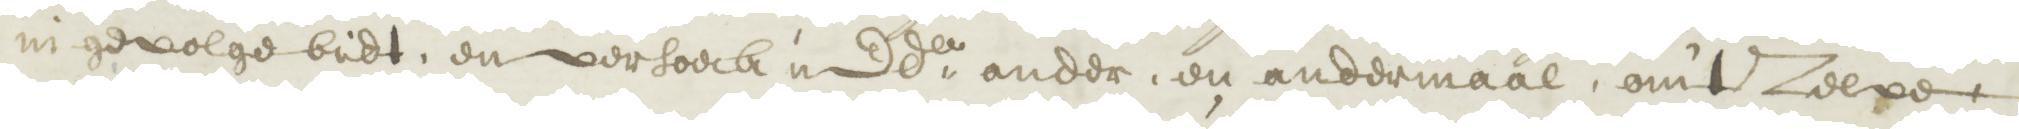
in gevolge bidt, en versoeck u Ed„le ander, en andermaal, om ’t zelve,
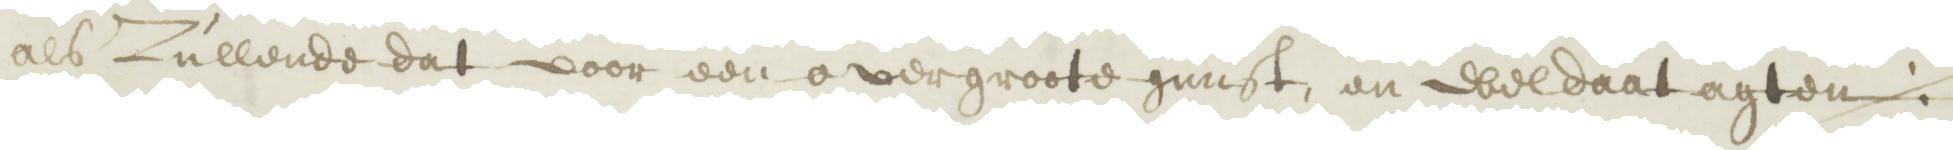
als zullende dat voor een overgroote gunst, en weldaat agten:
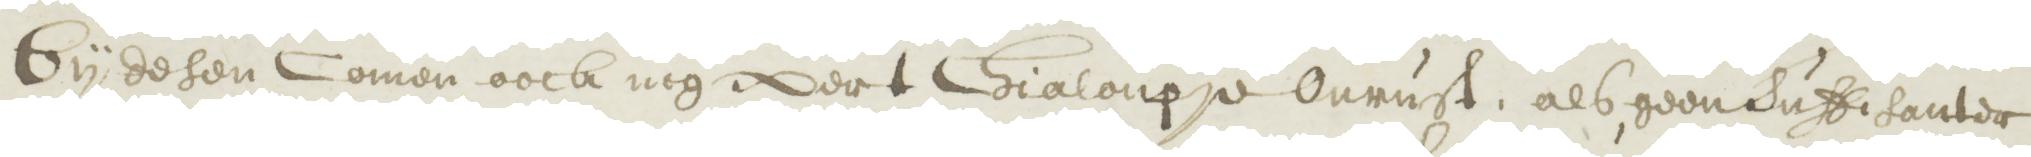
bij desen comen oock nog per 't Chialoupje Onrust, als geen suffisanter
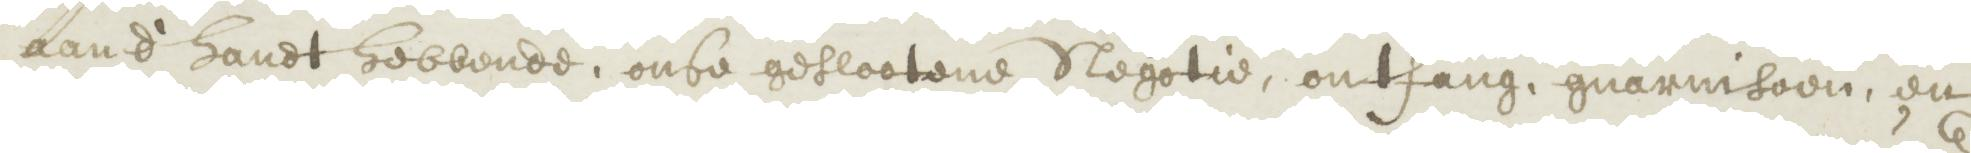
aan d’ handt hebbende, onse geslootene Negotie, ontfang, guarnisoen, en
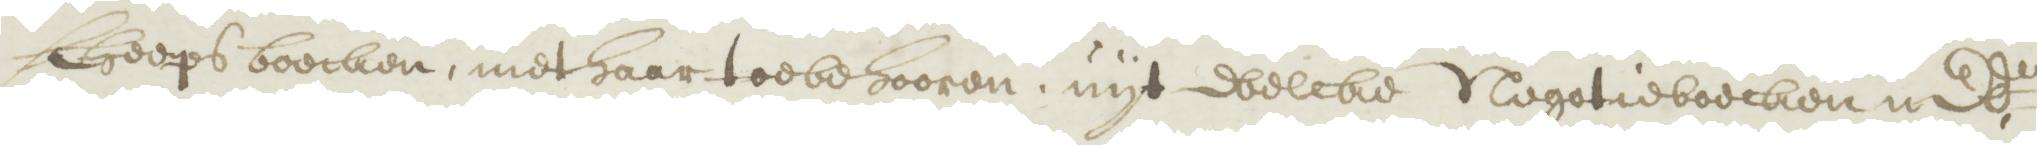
scheeps boecken, met haar toebehooren, uijt welcke Negotieboecken u Ed,=e
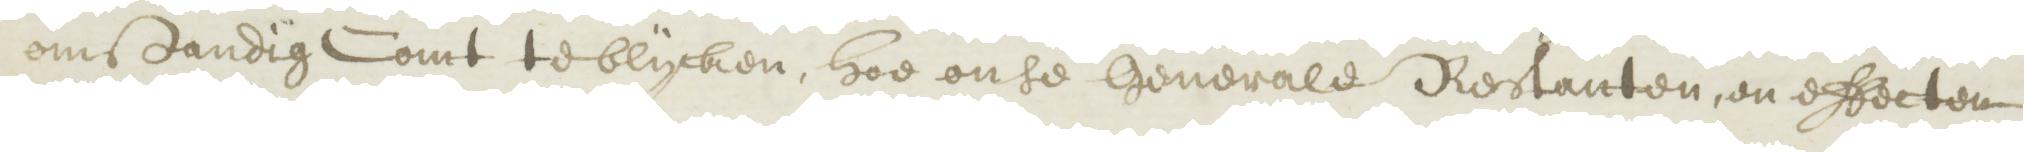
omstandig comt te blijcken, hoe onse generale Restanten, en effecten
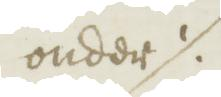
onder ./.
